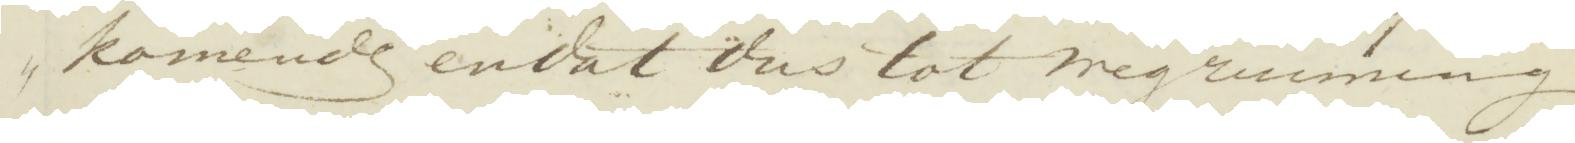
„komende en dus tot wegruiming
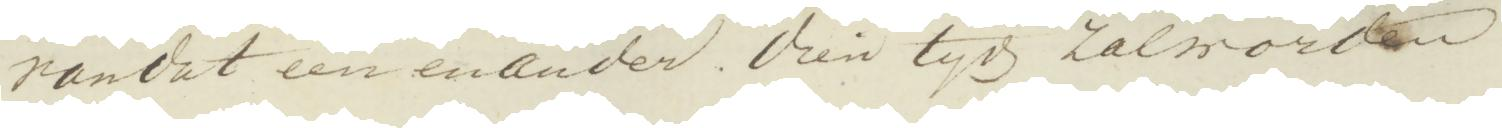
van dat een en ander dien tijd zal worden
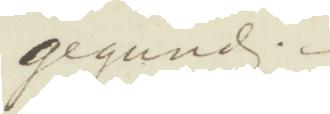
gegund.
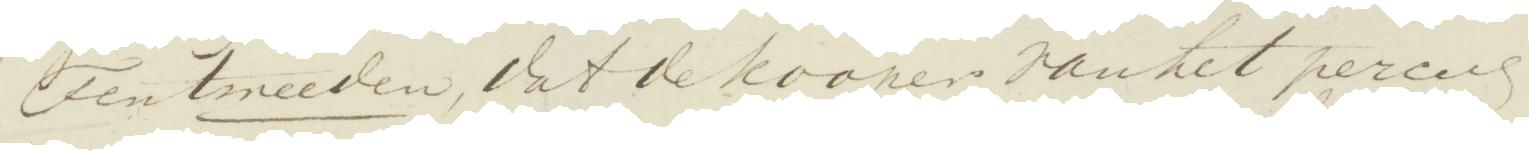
Ten tweeden, dat de kooper van het perceel
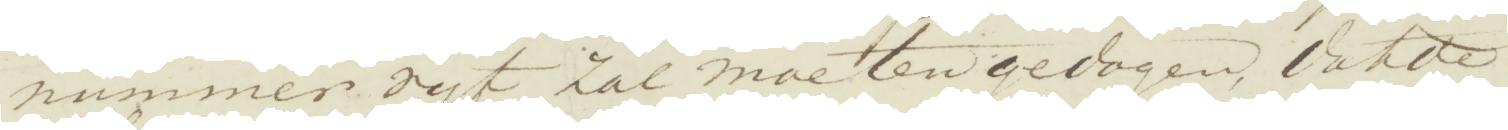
nummer vyf zal moeten gedogen, dat de
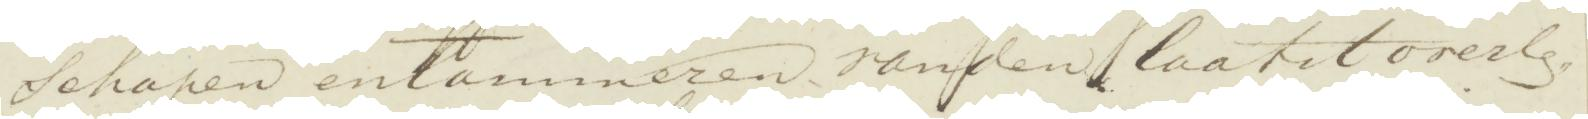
schapen en lammeren van den laatst overle„
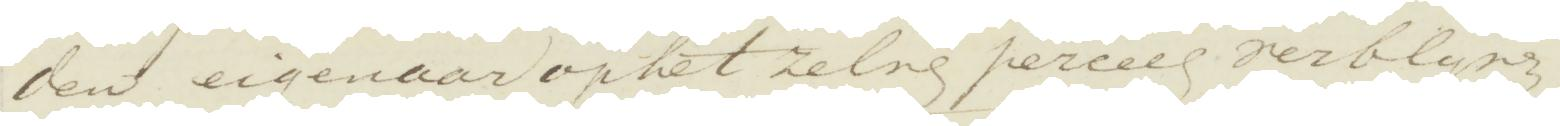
den eigenaar op het zelve perceel verblijven
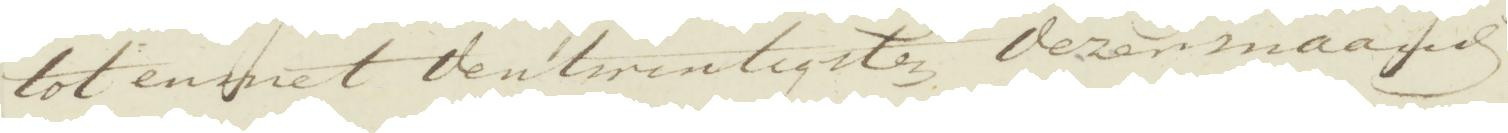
tot en met den twintigsten dezen maand
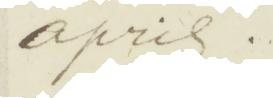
april.
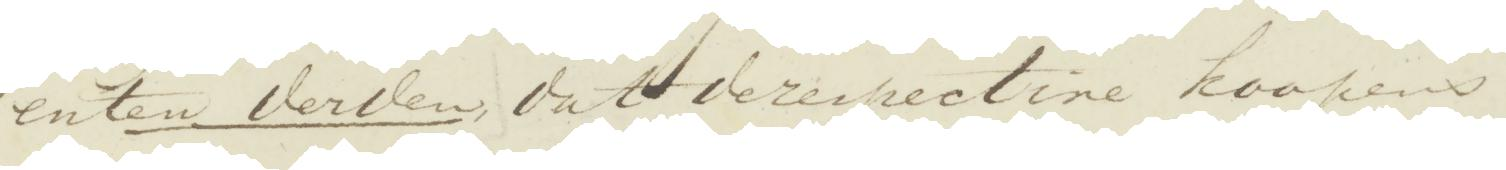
en ten derden, dat de respective koopers
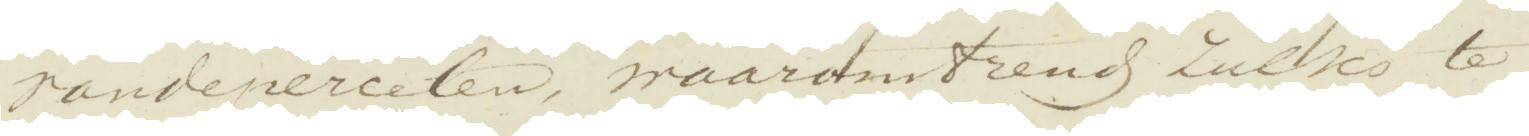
van de percelen, waaromtrend zulks te
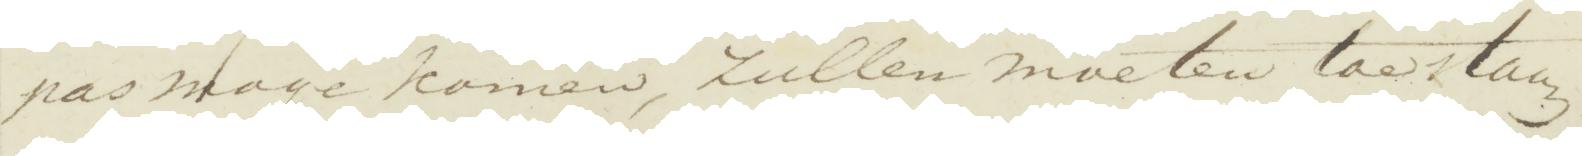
pas moge komen, zullen moeten toestaan
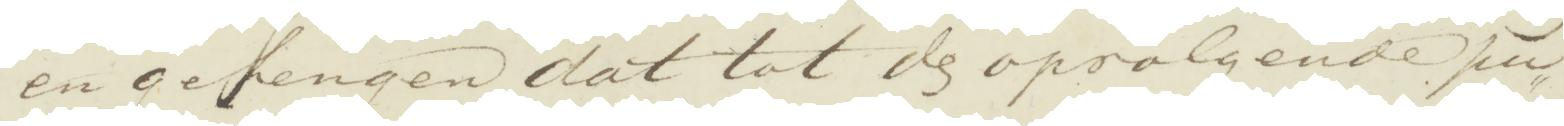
en gehengen dat tot de opvolgende pu„
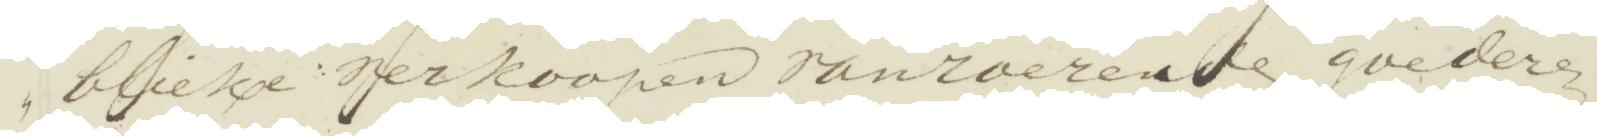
„blieke verkoopen van roerende goederen
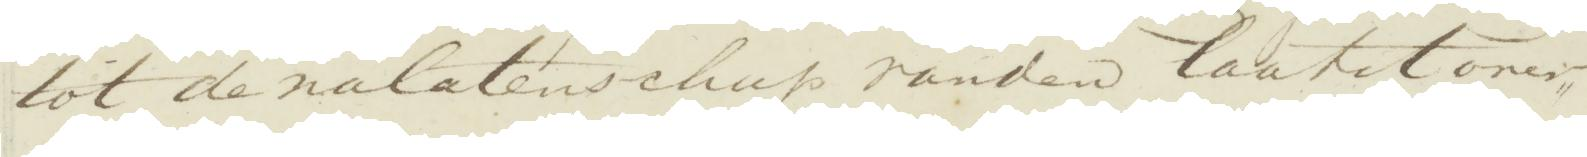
tot de nalatenschap van den laatst over„
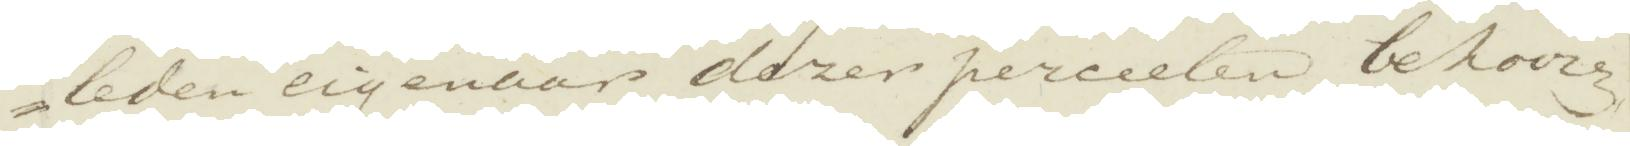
„leden eigenaar dezer perceelen behooren„
